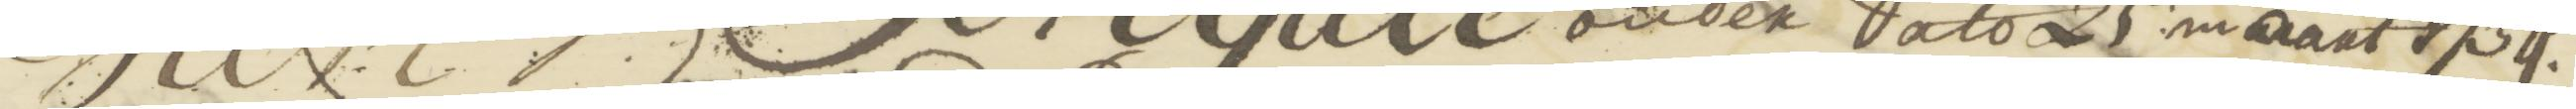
Van Bengale onder dato 25:' maart 1734.
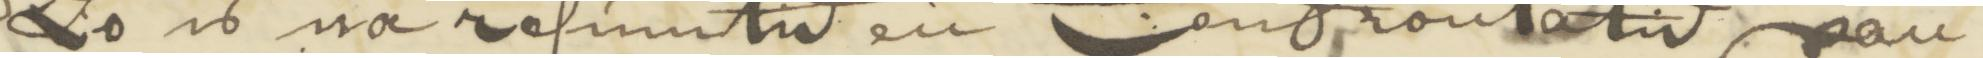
Zo is na resumtie en confrontatie van
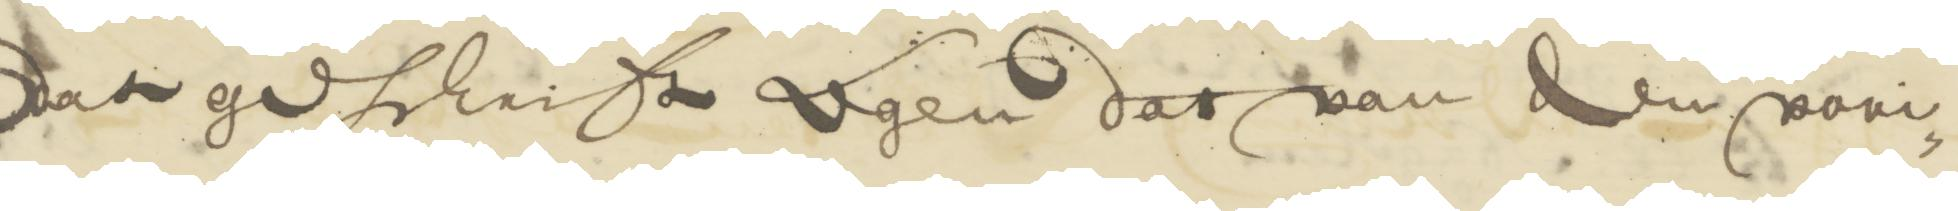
dat geschrift tegen dat van den vori„
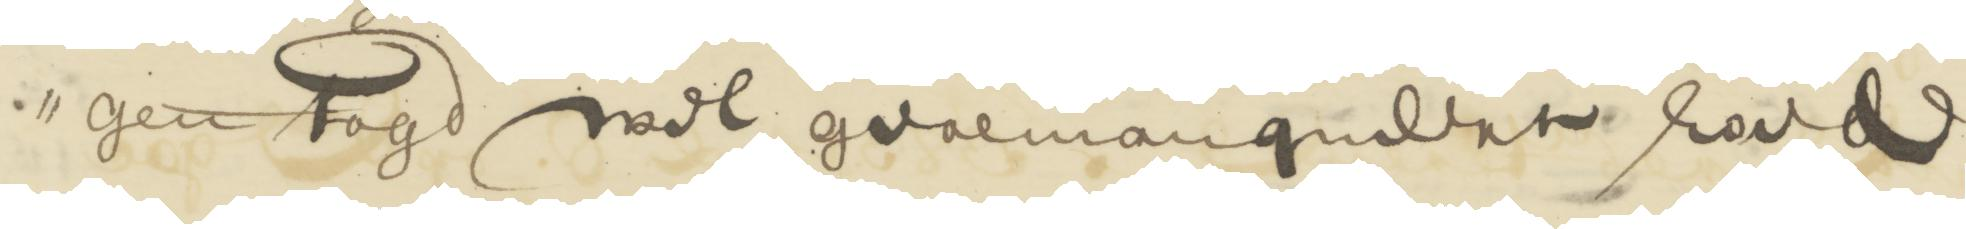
„gen Togd wel geremanqueert hoe de
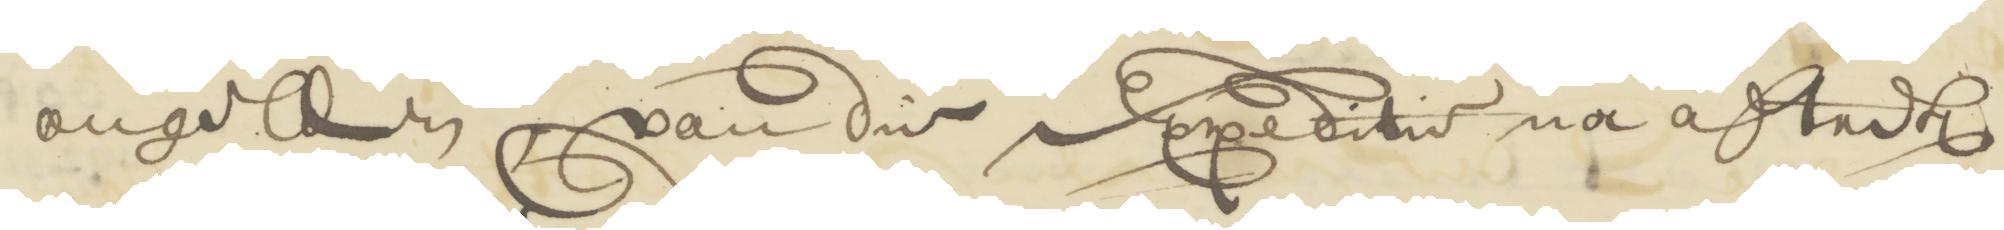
ongelden van die Expeditie na aftrek
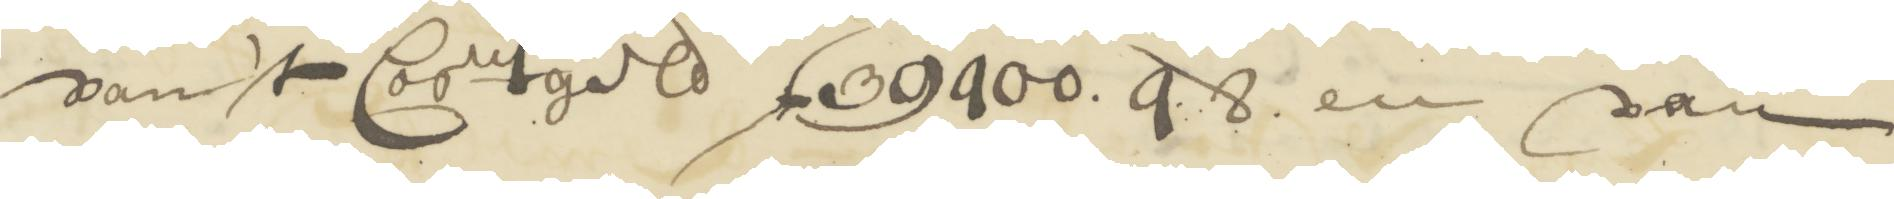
van ’t Costgeld ƒ39400.4:8. en van
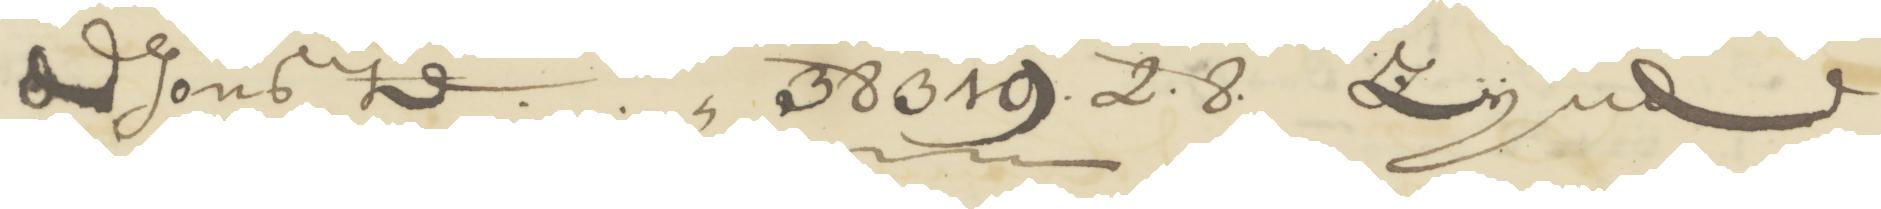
de Jonste . . „ 38319.2.8. Zijnde
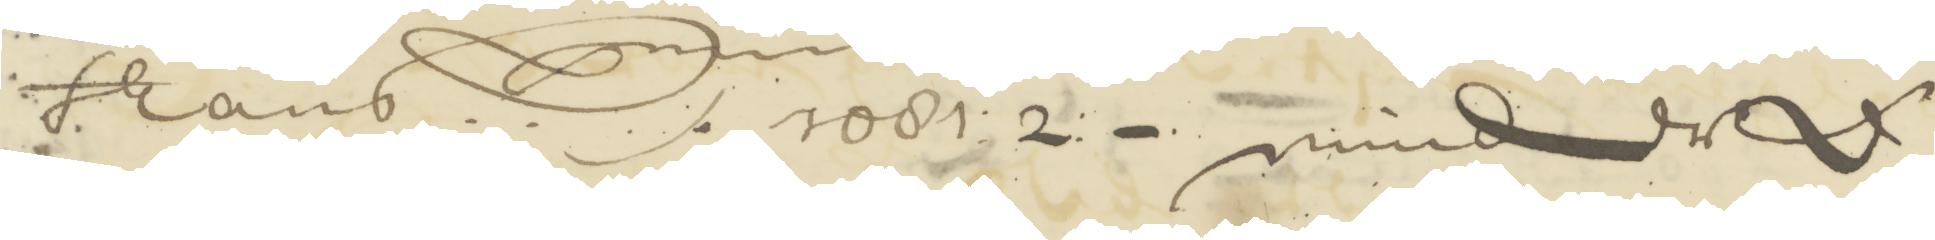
thans . . . ƒ 1081:2:- . minder te
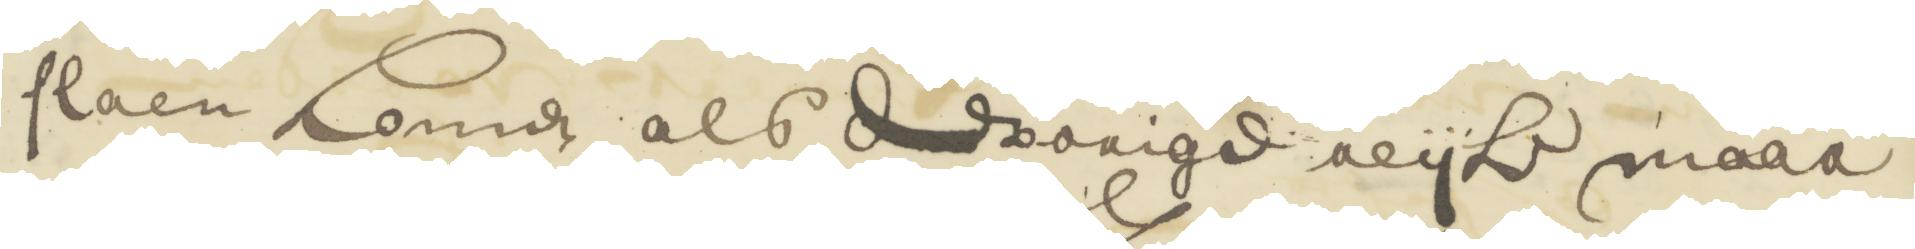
staen Comen als de vorige reijse maar
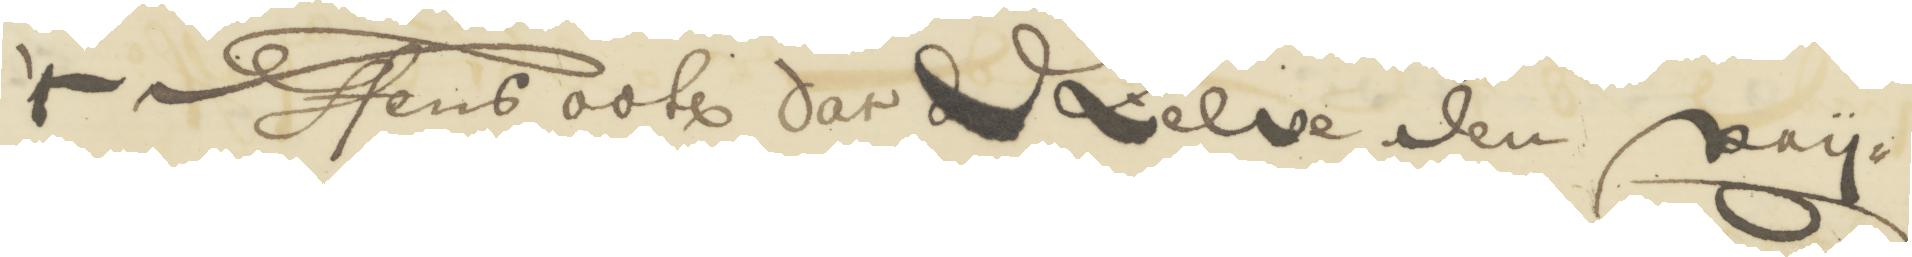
’t Effens ook dat de zelve een vrij
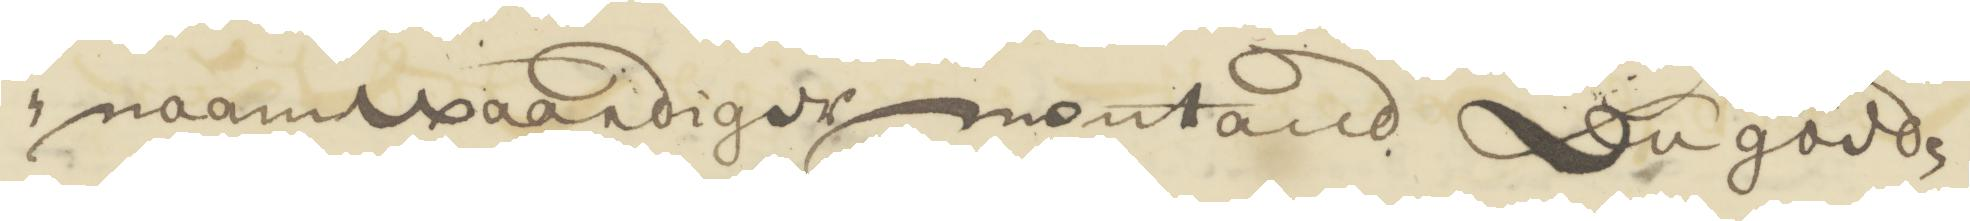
„naamwaardiger montand ten goeden
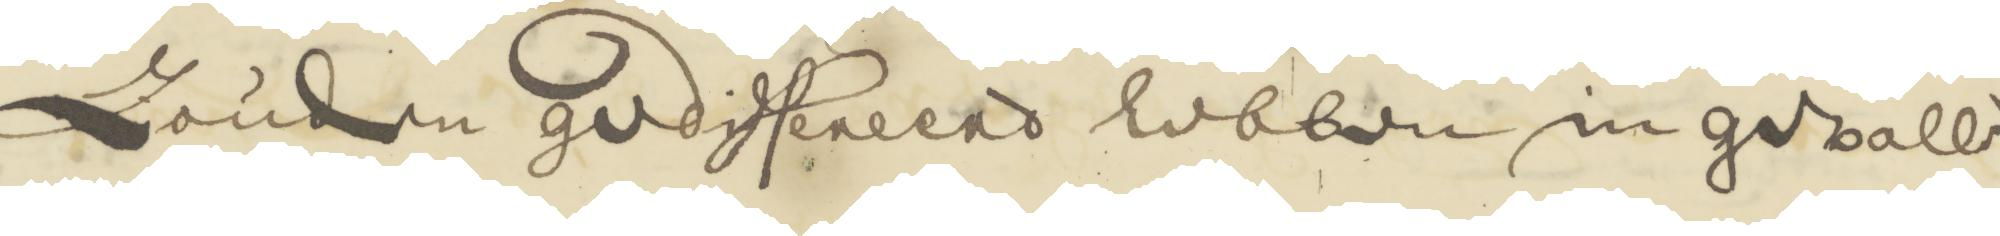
Zouden gediffereerd hebben in gevalle
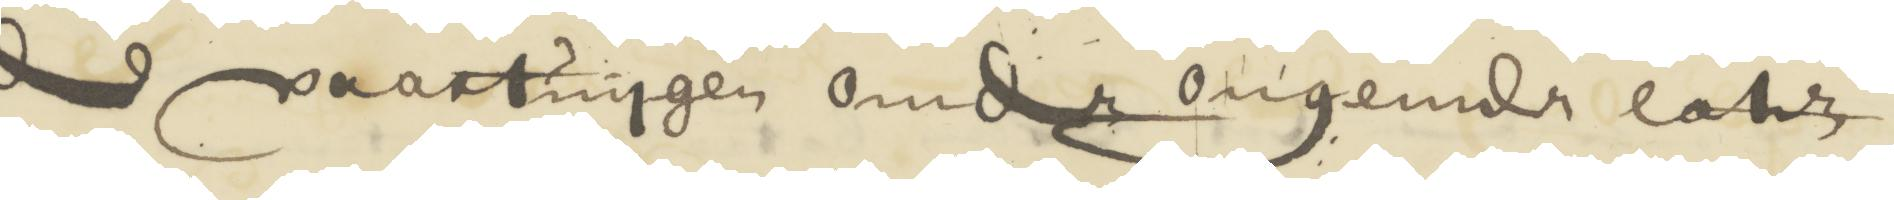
de vaartuijgen om den ongemene laten
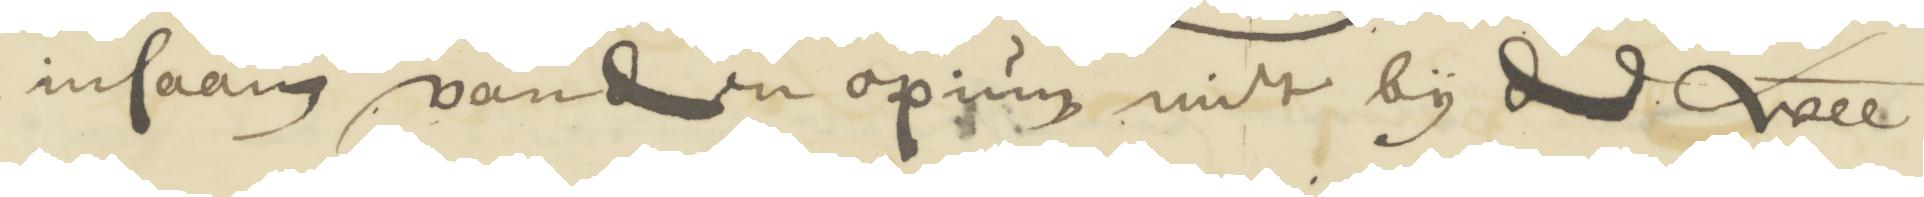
insaam van den opium niet bij de twee
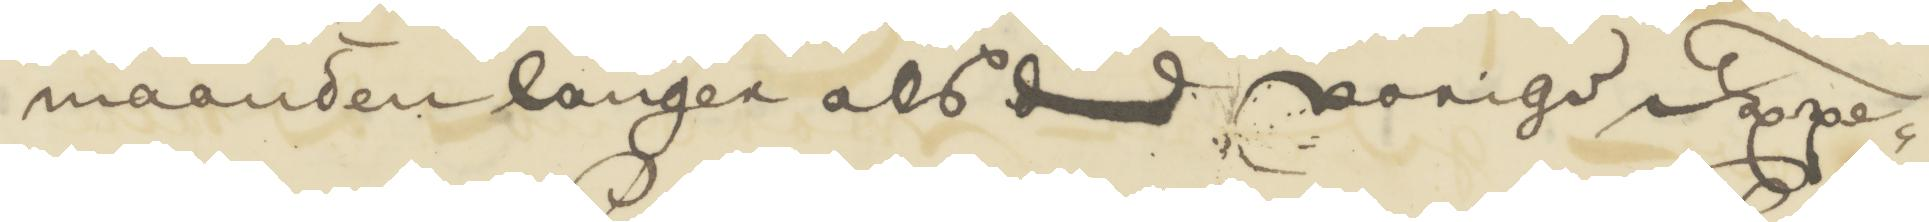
maanden langer als de vorige Expe„
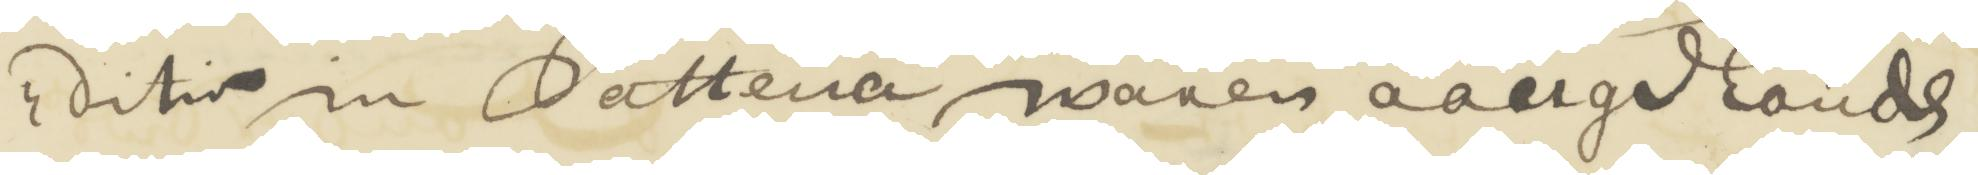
„ditie in Pattena waren aangehouden
